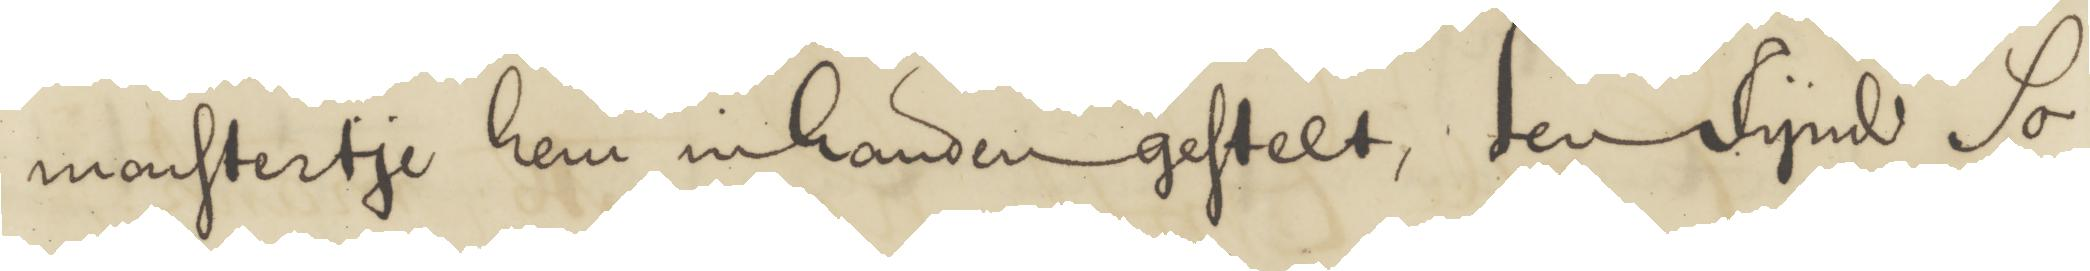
monstertje hem inhanden gestelt, ten Eijnde so
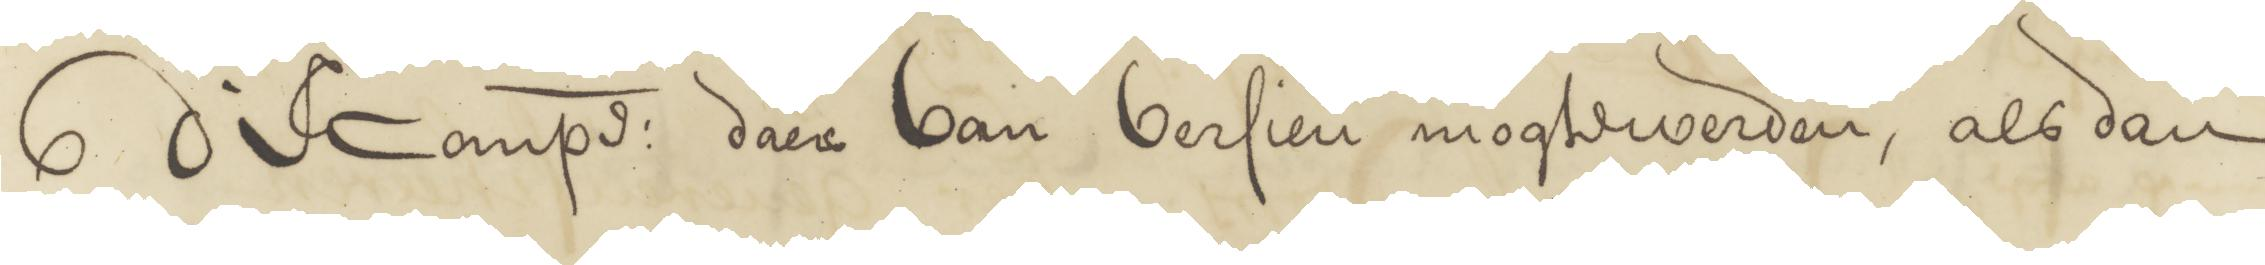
d’ECompe: daer van versien mogtewerden, als dan
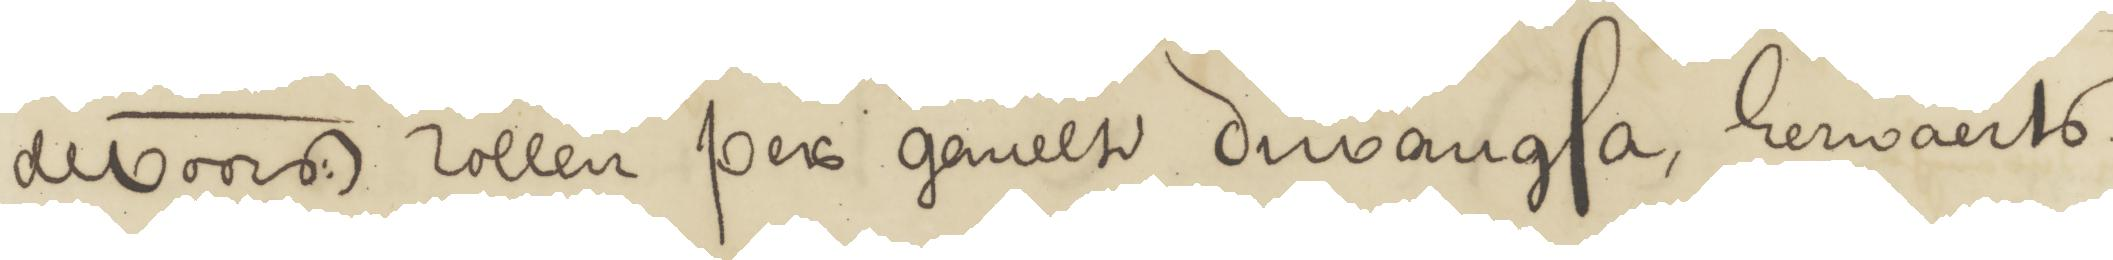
devoors: rollen per gemelte diwangsa, herwaerts
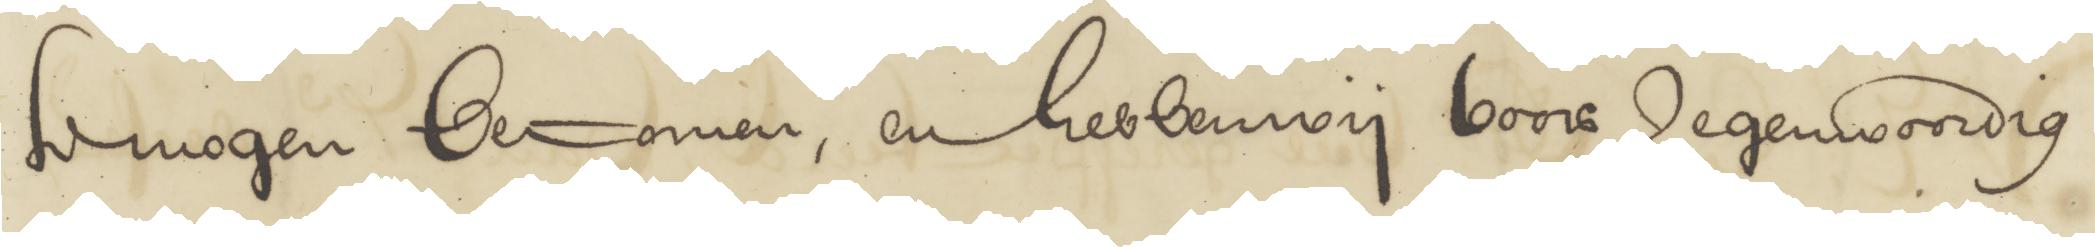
temogen becomen, en hebben wij voors jegenwoordig
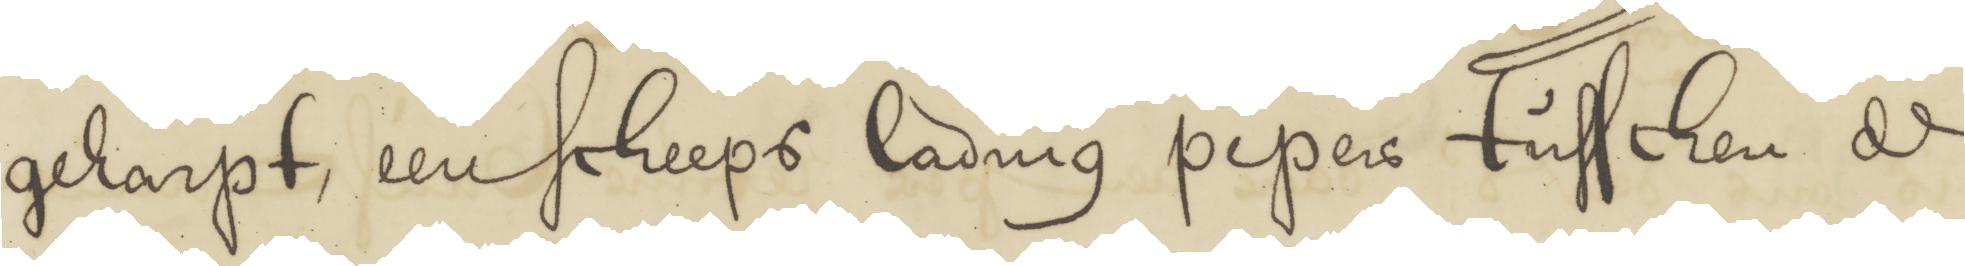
geharpt, een scheepss lading peper tusschen de
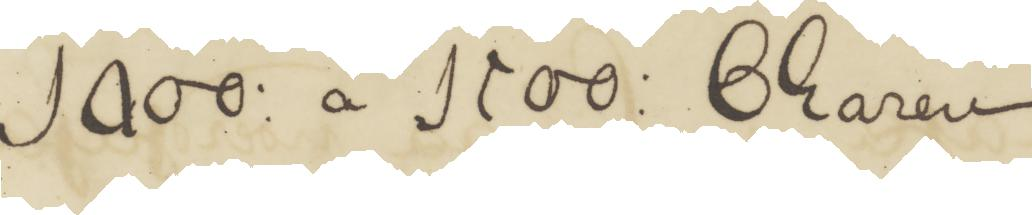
1400: á 1500: bharen
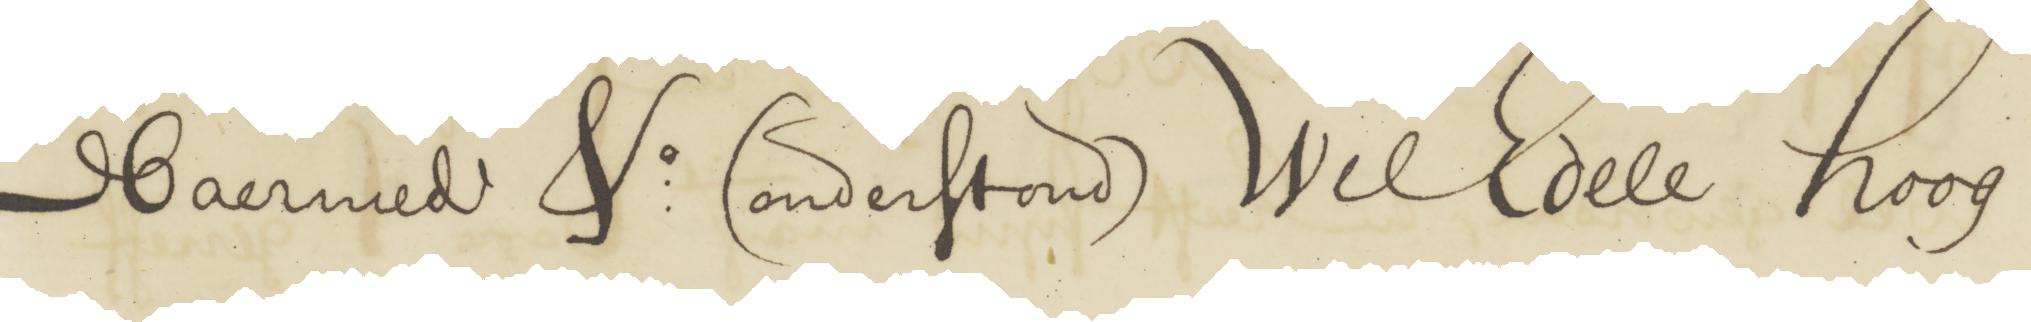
Waermede &:o (onderstond) Wel Edele Hoog
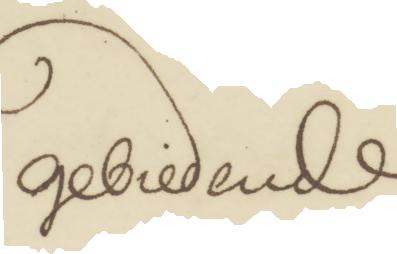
gebiedende
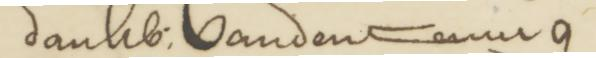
dankb: vanden coning
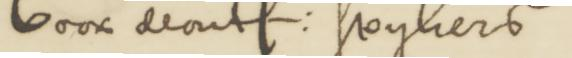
voor de ontf: spijkers
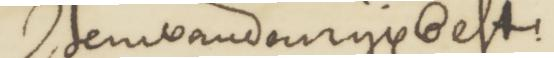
jtem van den rijxbest:
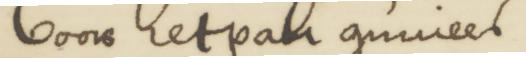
voor het pak guinees
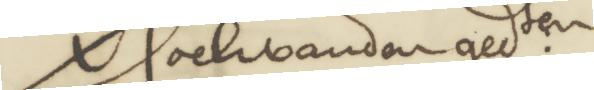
versoek vandan ged:ten
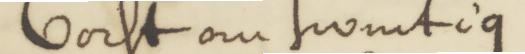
vorst om swintig
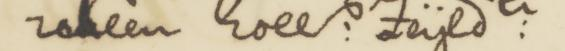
rollen holl:s zeijld:k
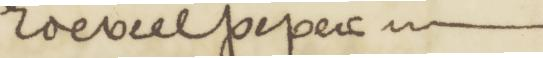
hoeveel peper in
